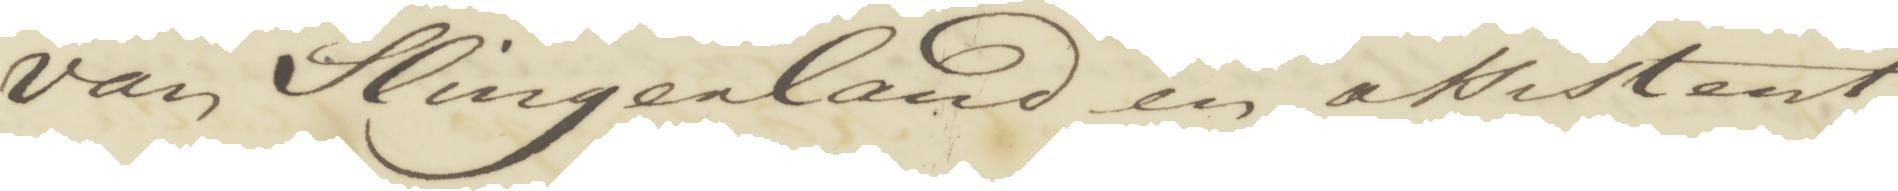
van Slingerland en assistent
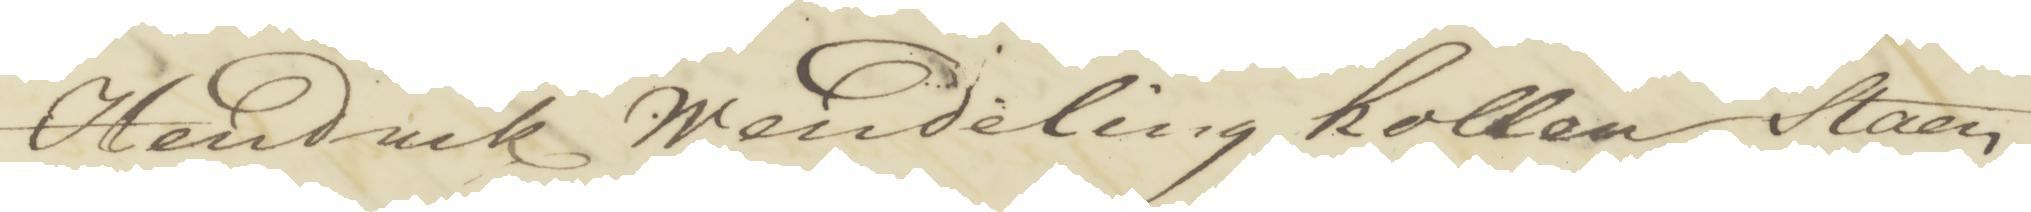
Hendrik Wendeling kollen, staen
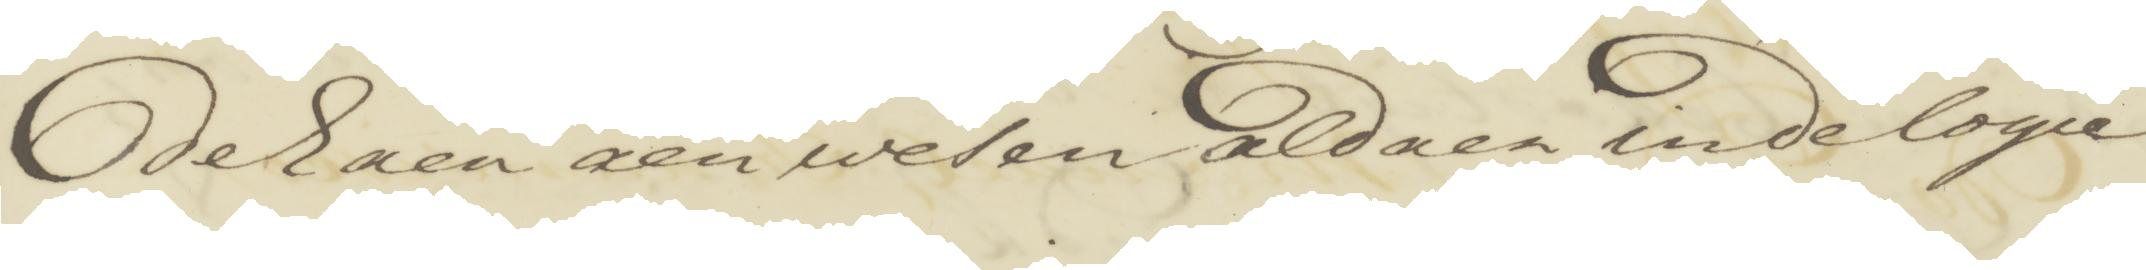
de haer aen wesen aldaer in de logie
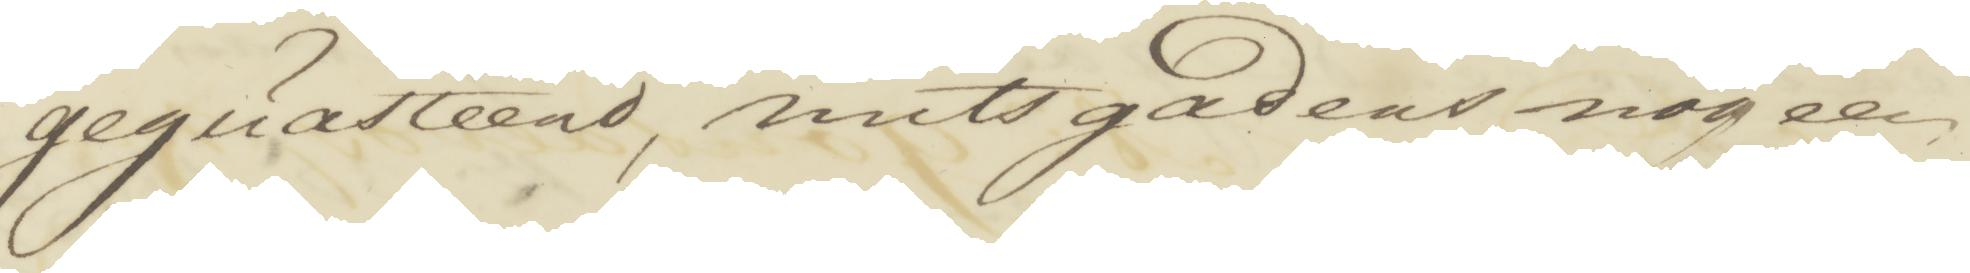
geguasteerd, mitsgaders nog een
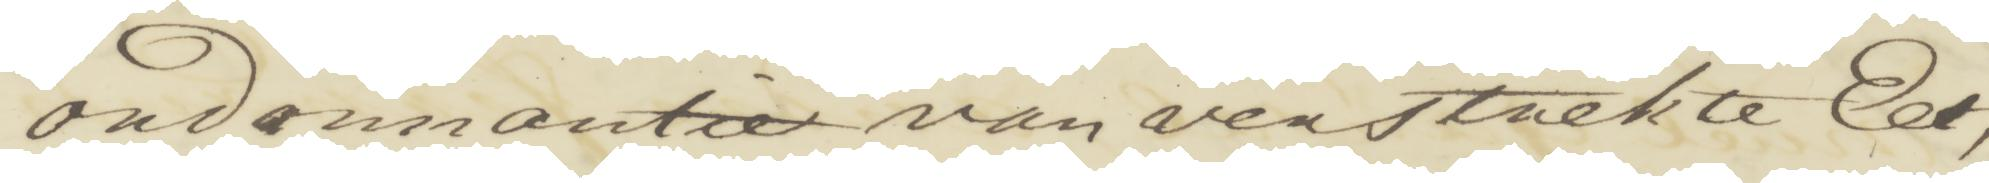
ordonnantie van verstrekte Eet
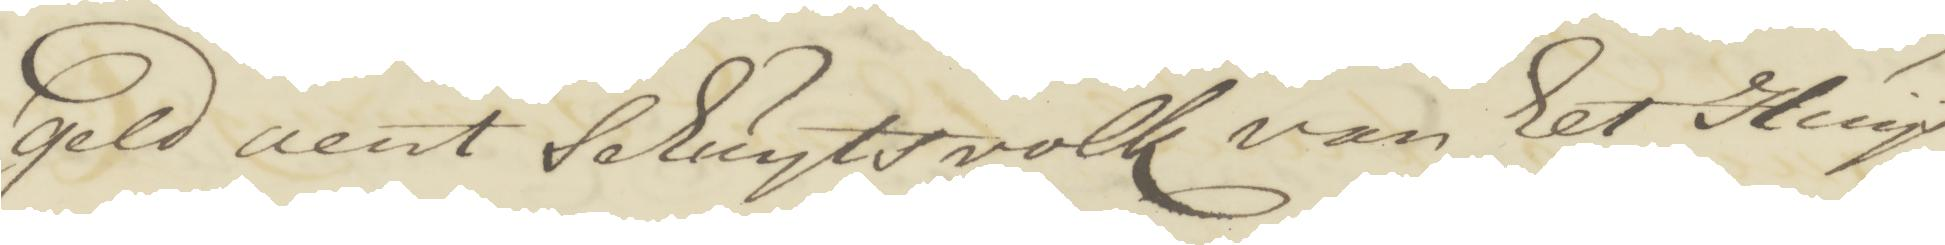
geld aen't schuytsvolk van het Huijs
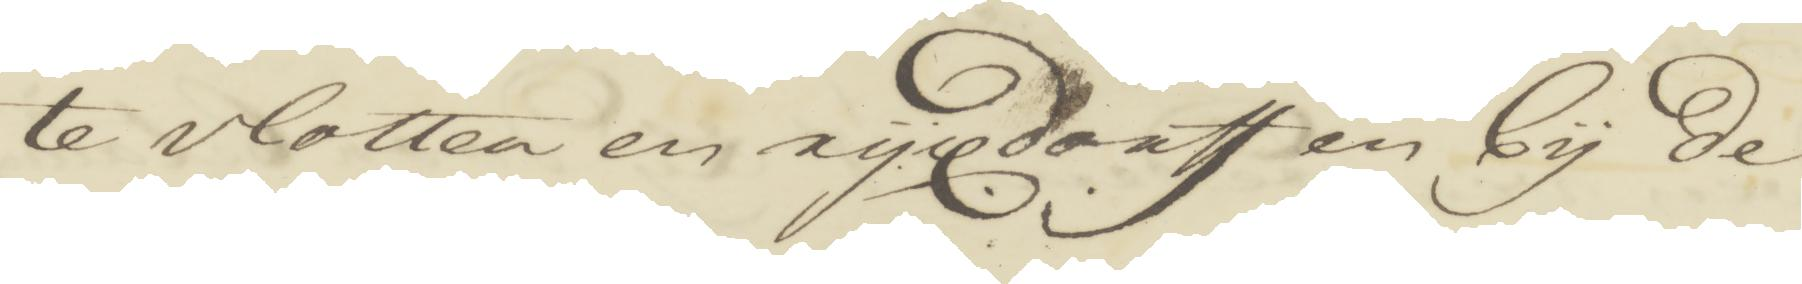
te vlotten en rijxdorff en bij de
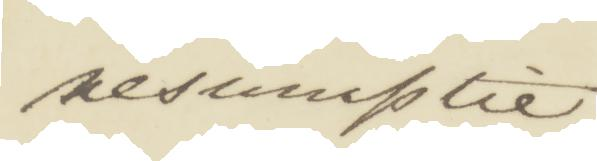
resumptie
